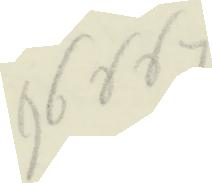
96887
